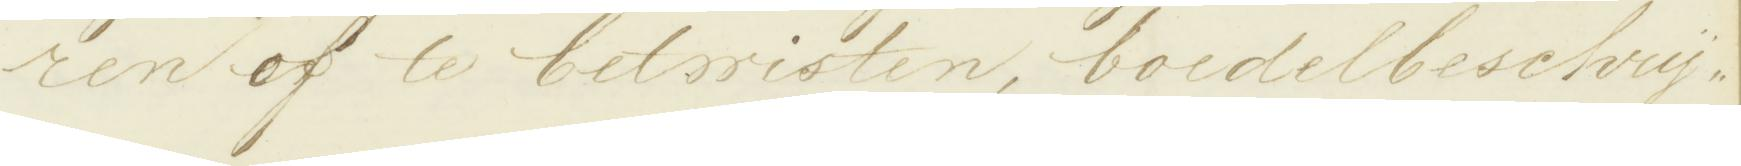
ren of te betwisten, boedelbeschrij„
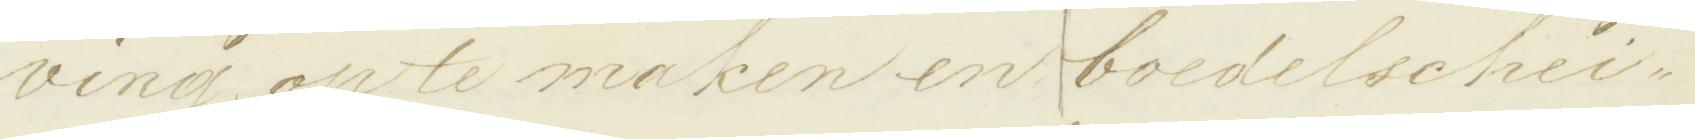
ving op te maken en / boedelschei„
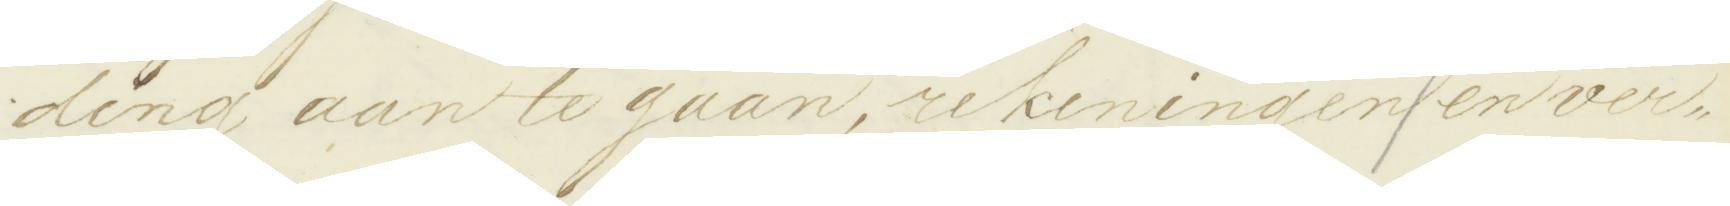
ding aan te gaan, rekeningen / en ver„
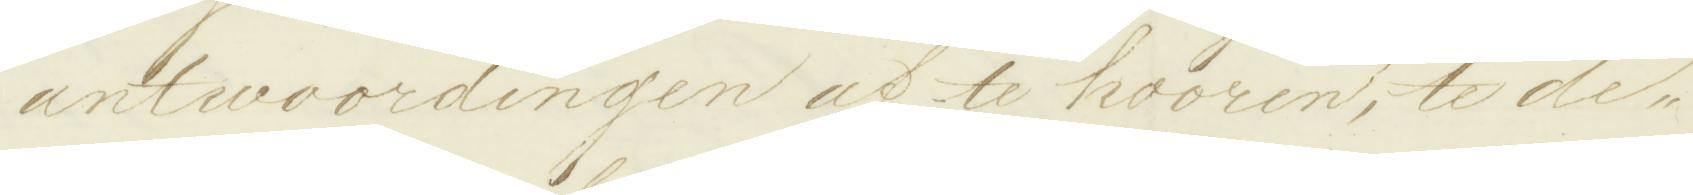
antwoordingen af te hooren, te de„
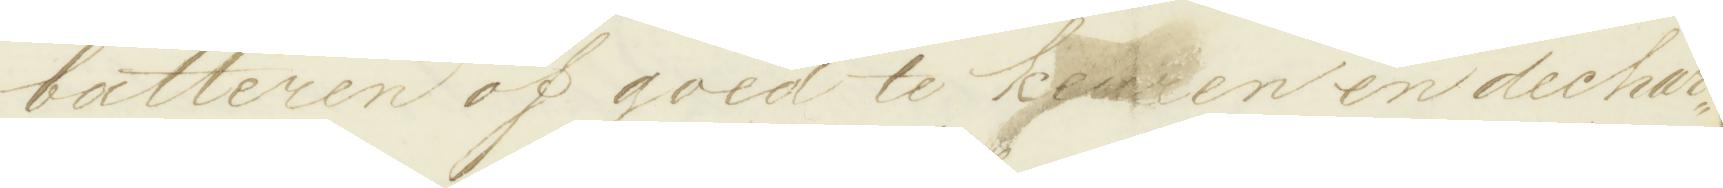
batteren of goed te keuren en dechar„
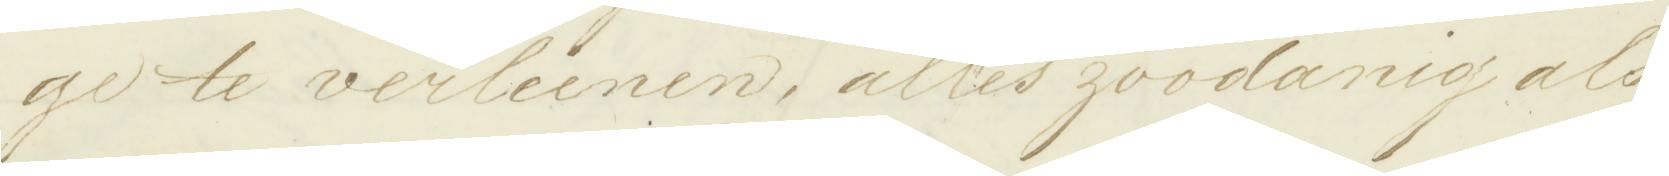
ge te verleenen, alles zoodanig als
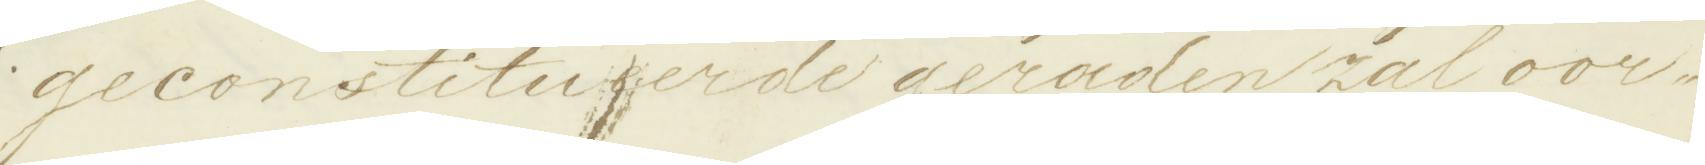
geconstitueerde geraden zal oor„
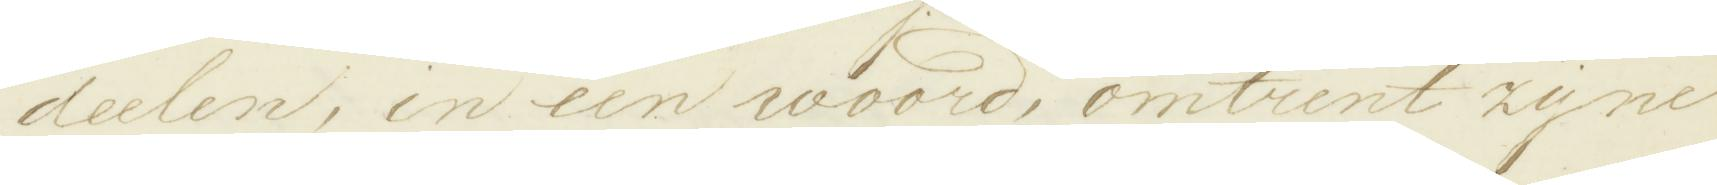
deelen, in een woord, omtrent zijne
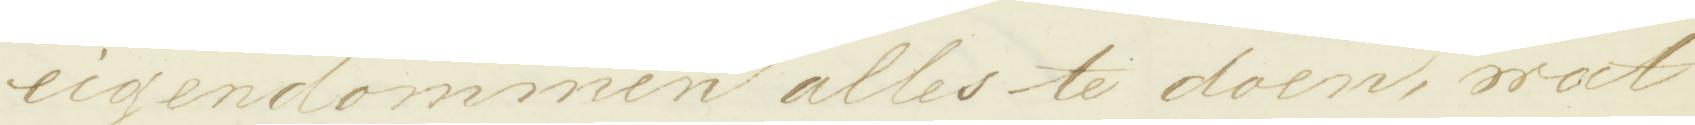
eigendommen alles te doen, wat
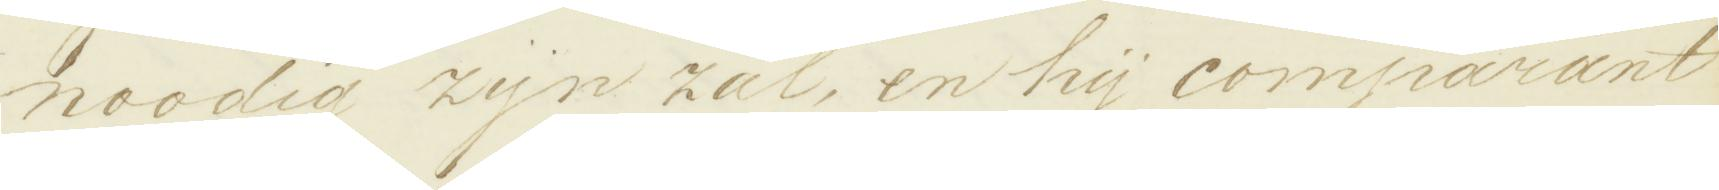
noodig zijn zal, en hij comparant
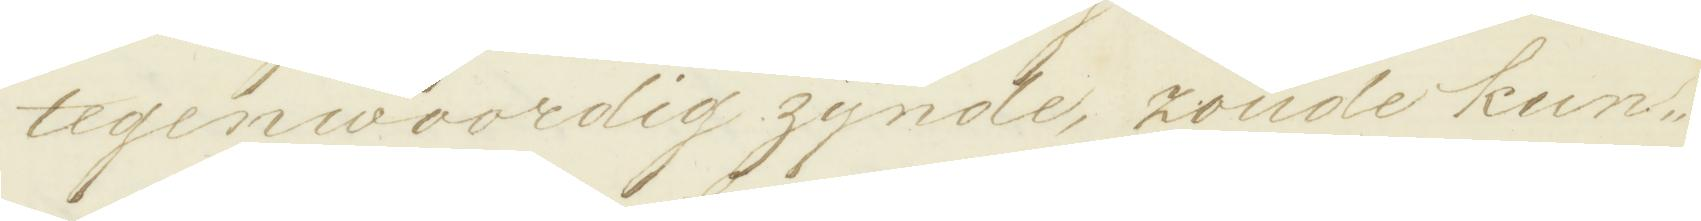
tegenwoordig zijnde, zoude kun„
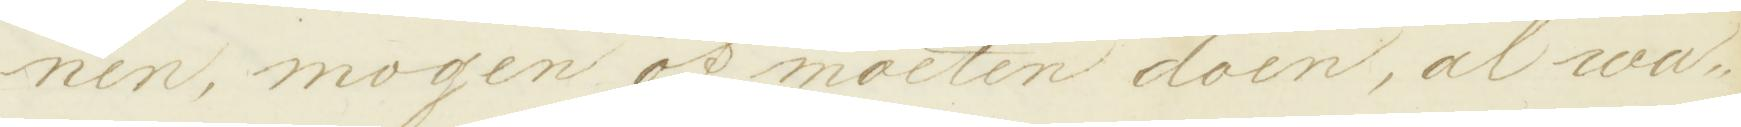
nen, mogen of moeten doen, al wa„
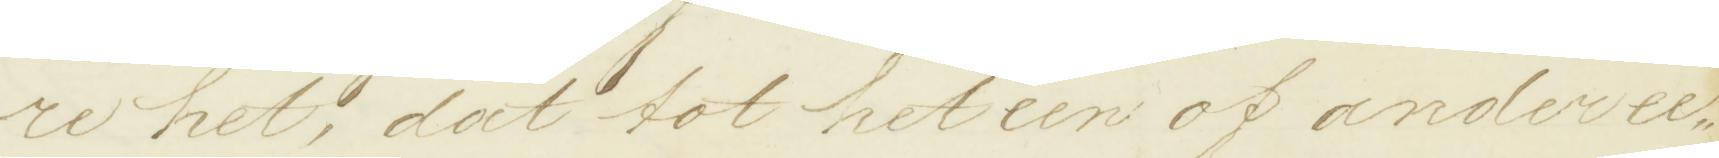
re het, dat tot het een of ander ee„
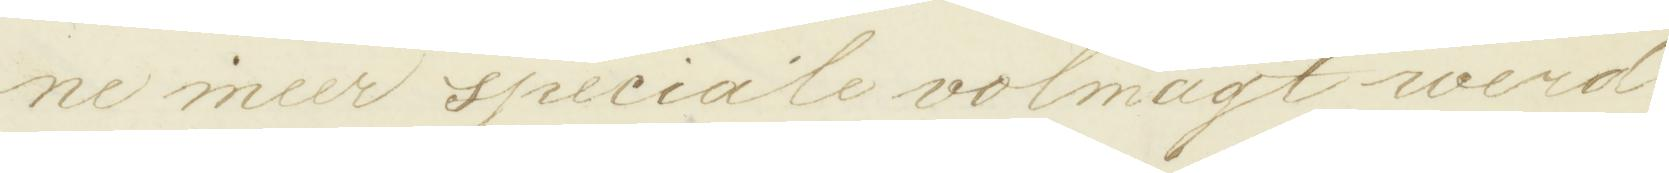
ne meer speciale volmagt werd
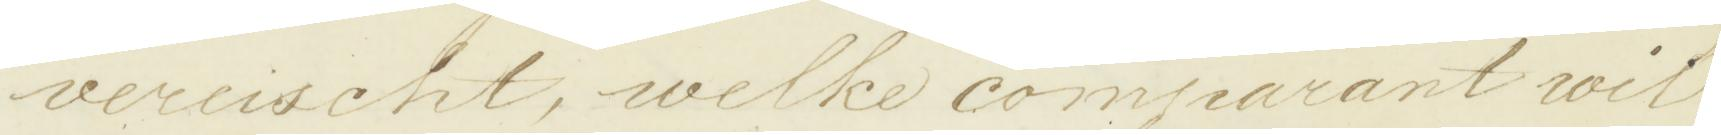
vereischt, welke comparant wil
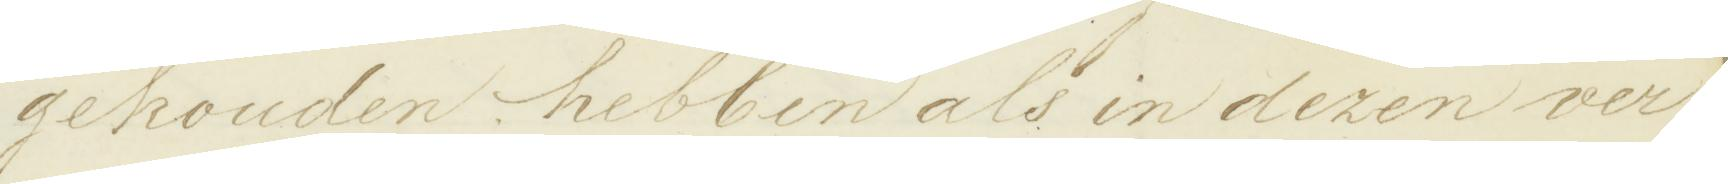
gehouden hebben als in dezen ver
